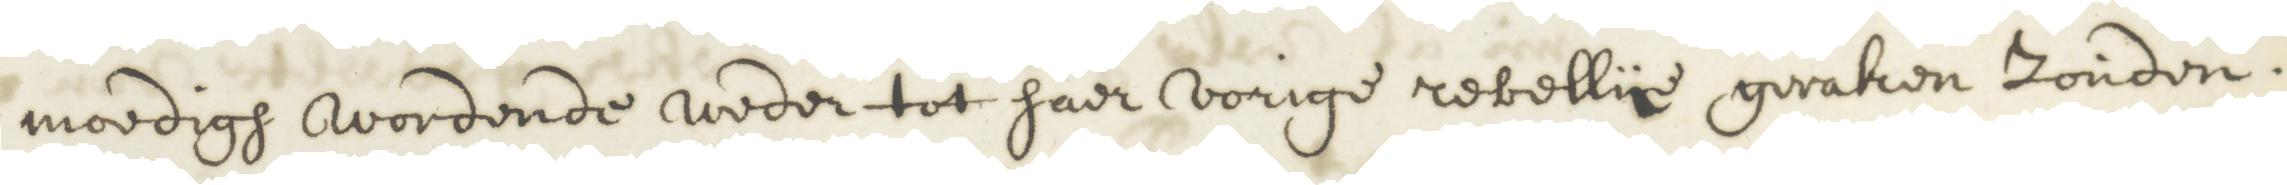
moedigh wordende weder tot haer vorige rebellije geraken zouden.
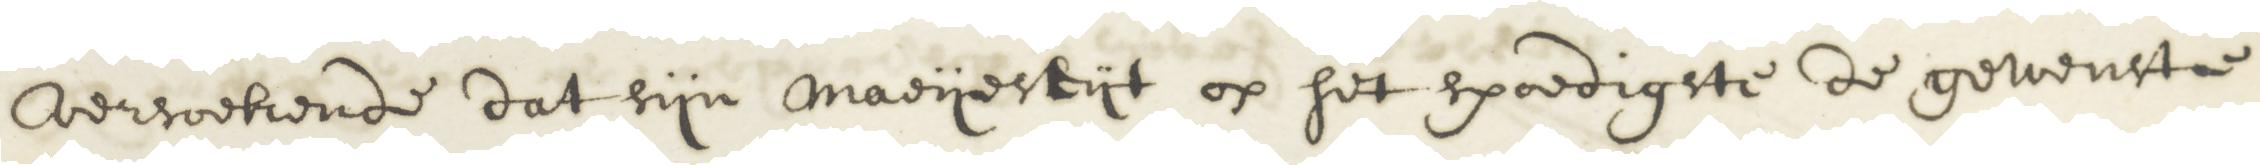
versoekende dat sijn maeijestijt op het spoedigste de gewenste
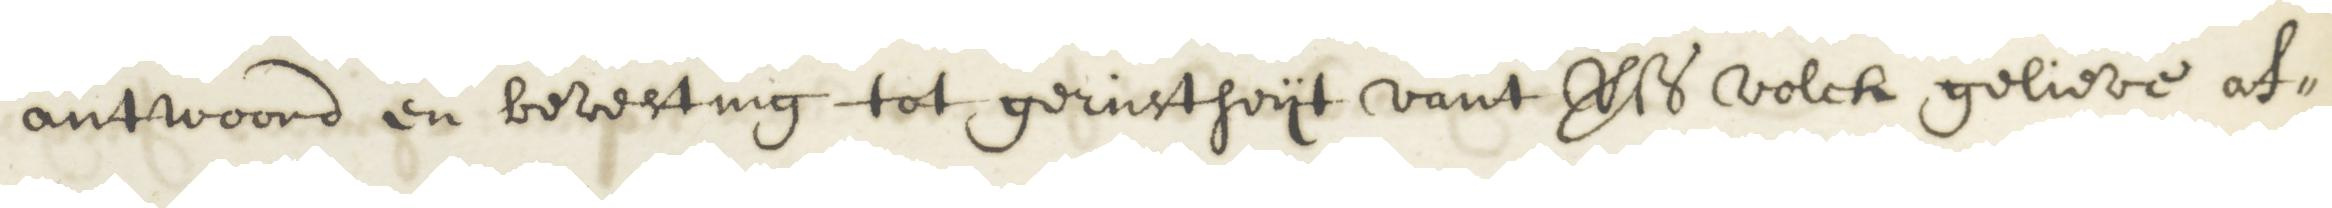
antwoord en bevesting tot gerustheijt vant vs volck gelieve af„
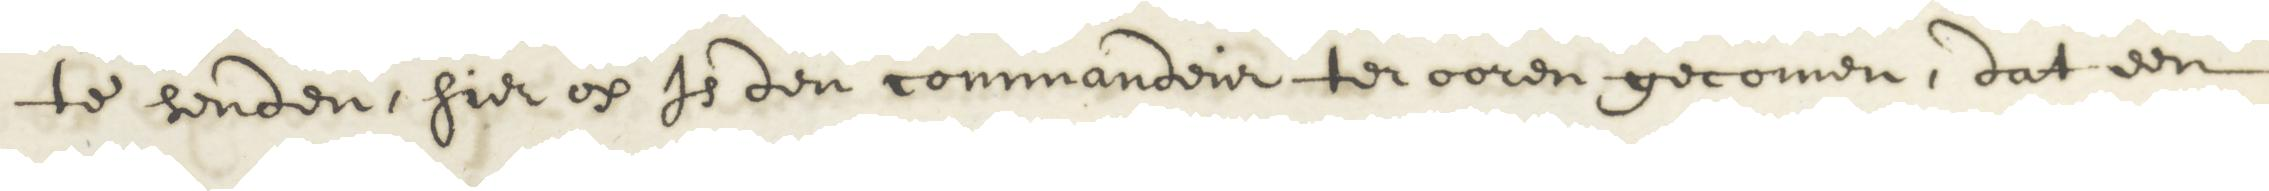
te senden, hier op Js den commandeur ter ooren gecomen, dat een
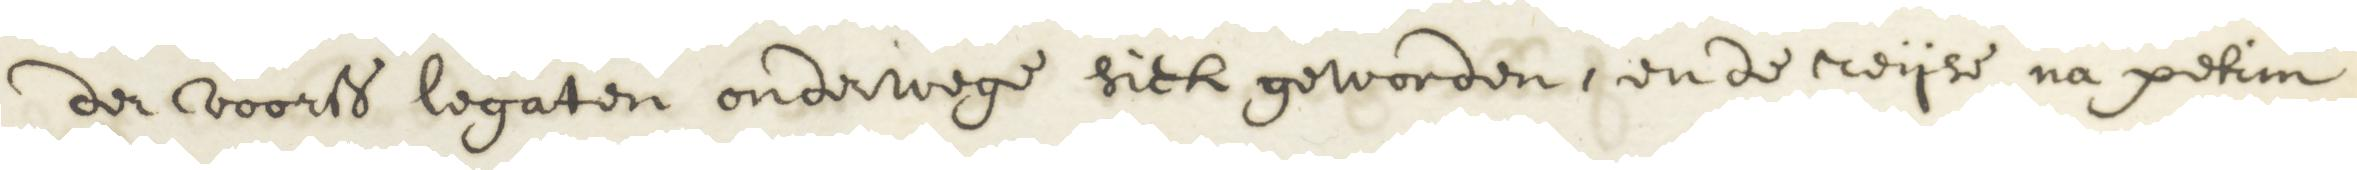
der voors legaten onderwege sich geworden, en de reijse na pekin
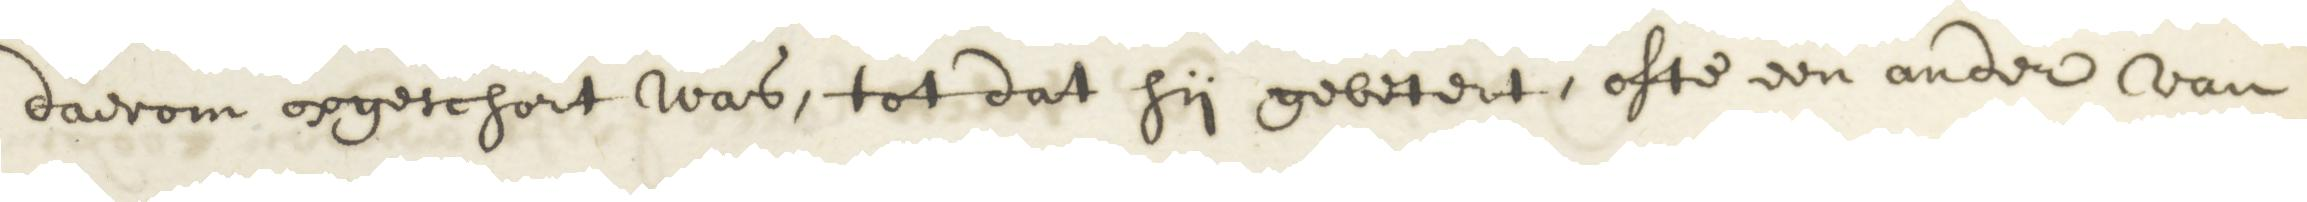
daerom opgeschort was, tot dat hij gebetert, ofte een ander van
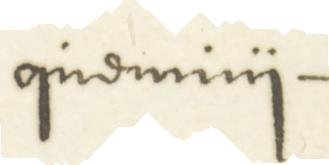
quemuij
